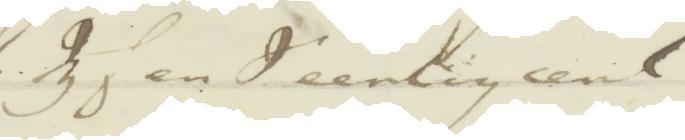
Vyf en Veertig cent
